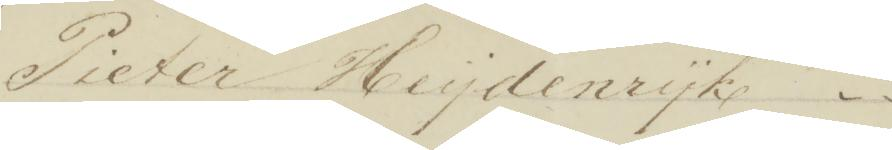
Pieter Heijdenrijk —
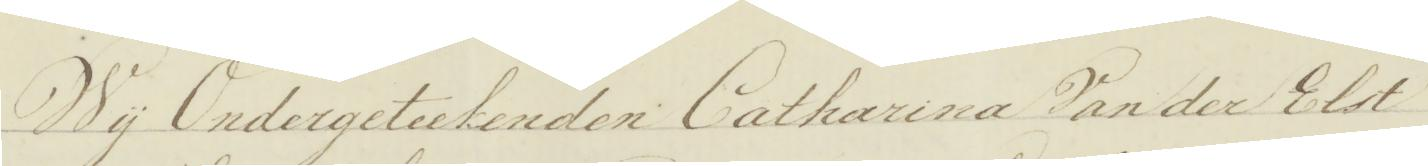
Wij Ondergeteekenden Catharina Van der Elst
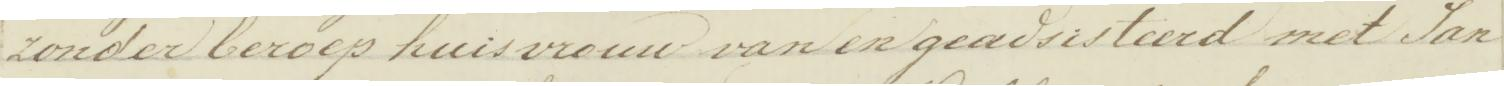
zonder beroep huisvrouw van en geadsisteerd met Ian
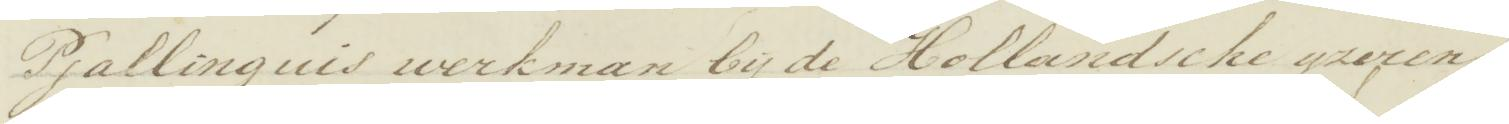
Tjallinguis werkman bij de Hollandsche yzeren
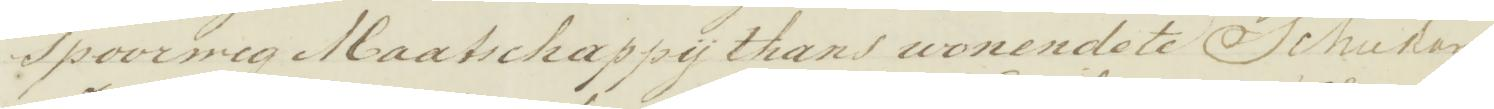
spoorweg Maatschappij thans wonende te Schiedam
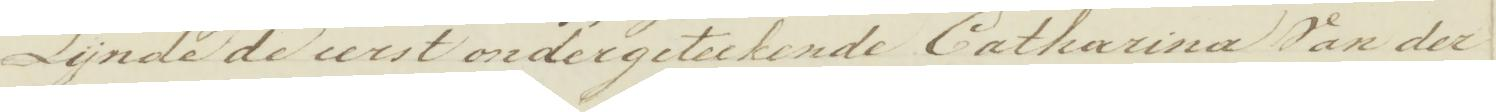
Zijnde de eerst ondergeteekende Catharina Van der
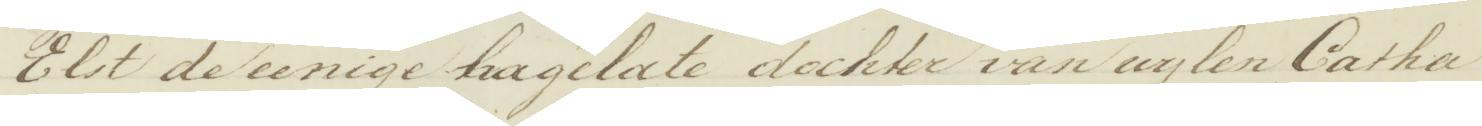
Elst de eenige nagelate dochter van wylen Catha
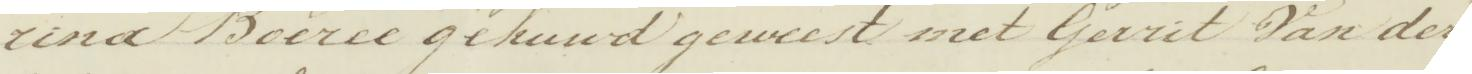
rina Boeree gehuwd geweest met Gerrit Van der
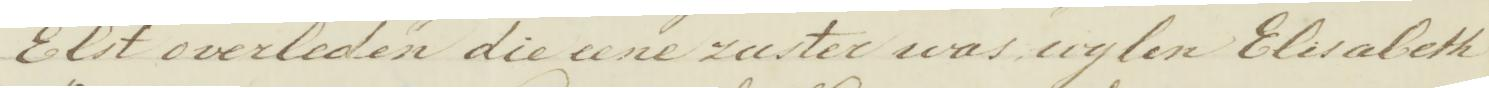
Elst overleden die eene zuster was wylen Elisabeth
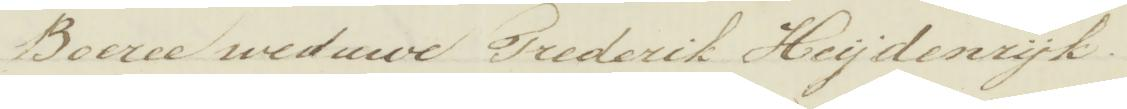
Boeree weduwe Frederik Heijdenrijk.
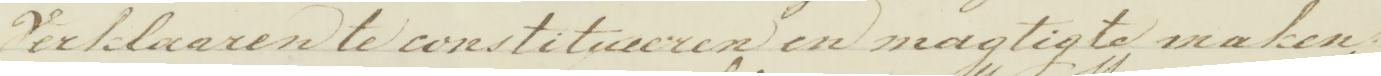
Verklaaren te constitueeren en magtig te maken:
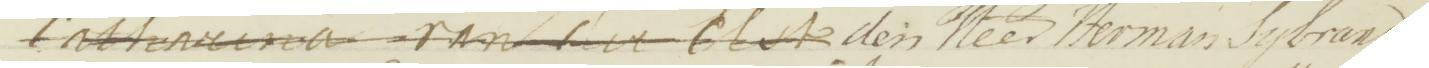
Catharina van der Elst den Heer Herman Sybrand
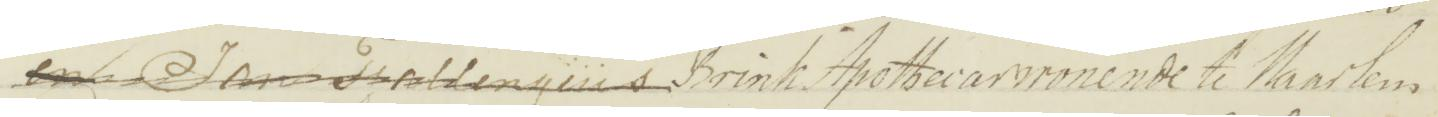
en Jan Tjallingius Brink Apotheker wonende te Haarlem
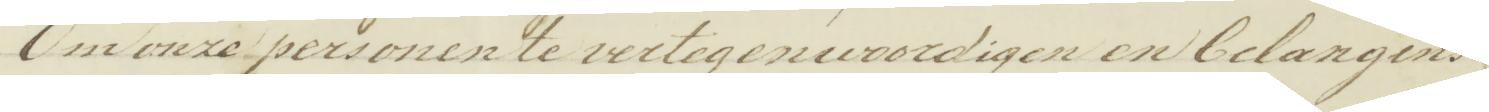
Om onze personen te vertegenwoordigen en belangens.
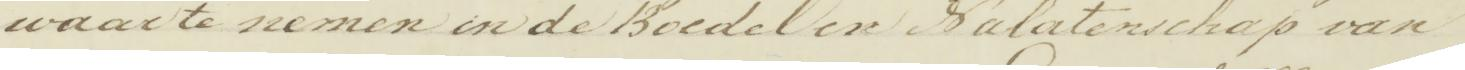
waar te nemen in de Boedel en Nalatenschap van
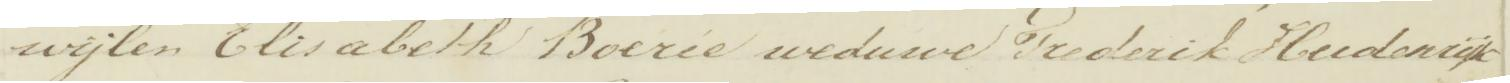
wijlen Elisabeth Boerée weduwe Frederik Heidenrijk
